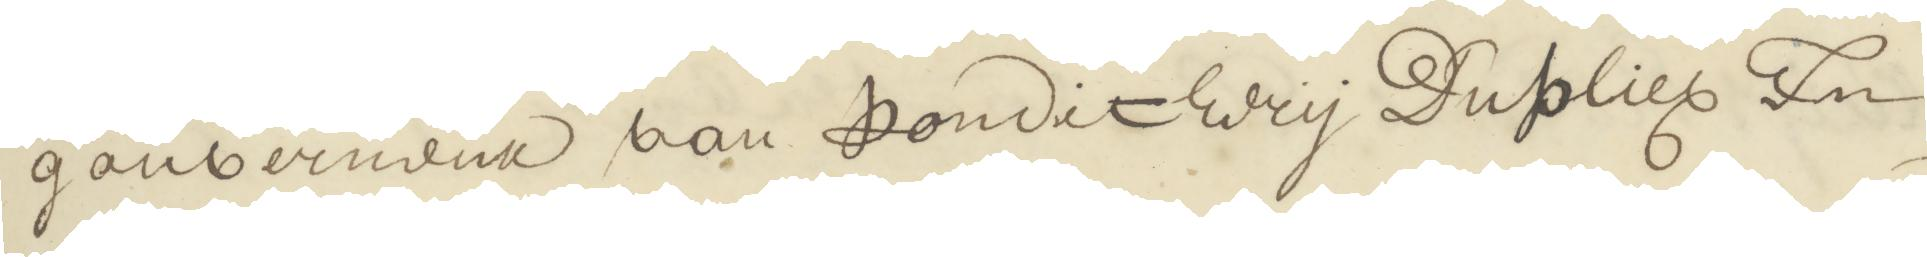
gouverneur van pondicherij Dupliex En
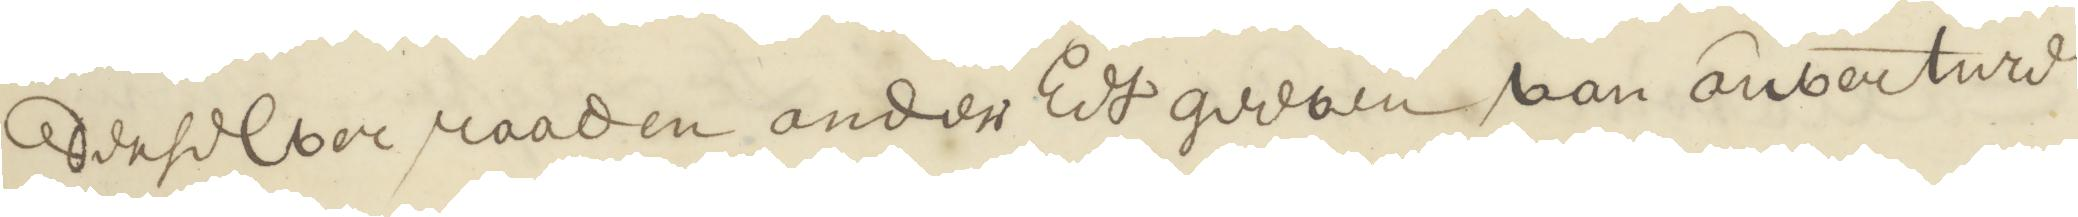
derselver raaden onder het geeven van ouverture
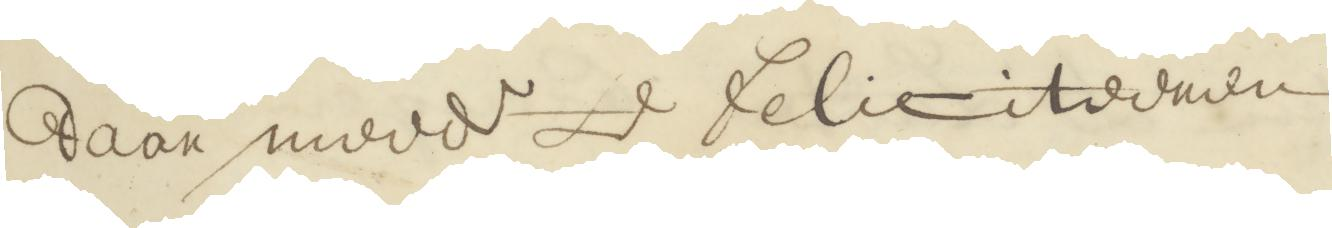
daar meede te feliciteeren
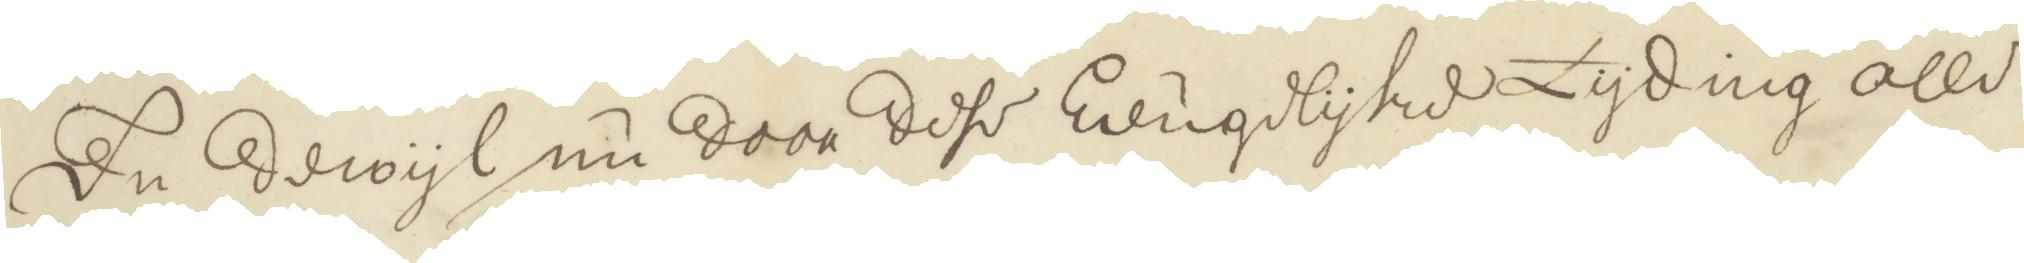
En dewijl nu door dese heugelijke tijding alle
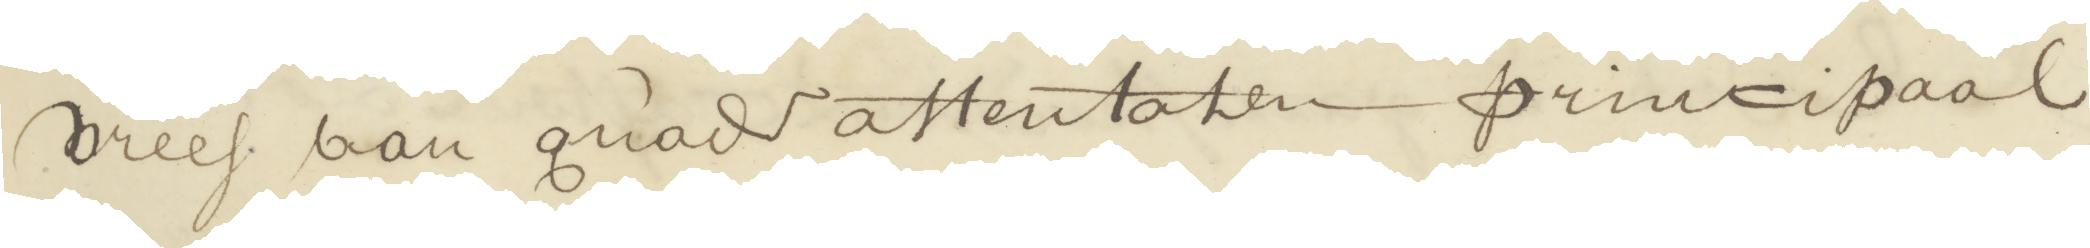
vrees van quade attentaten principaal
